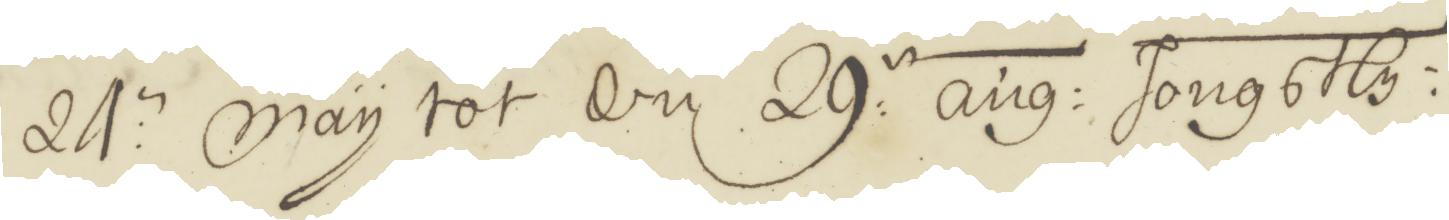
24:en maij tot den 29:en aug: Jongstln:
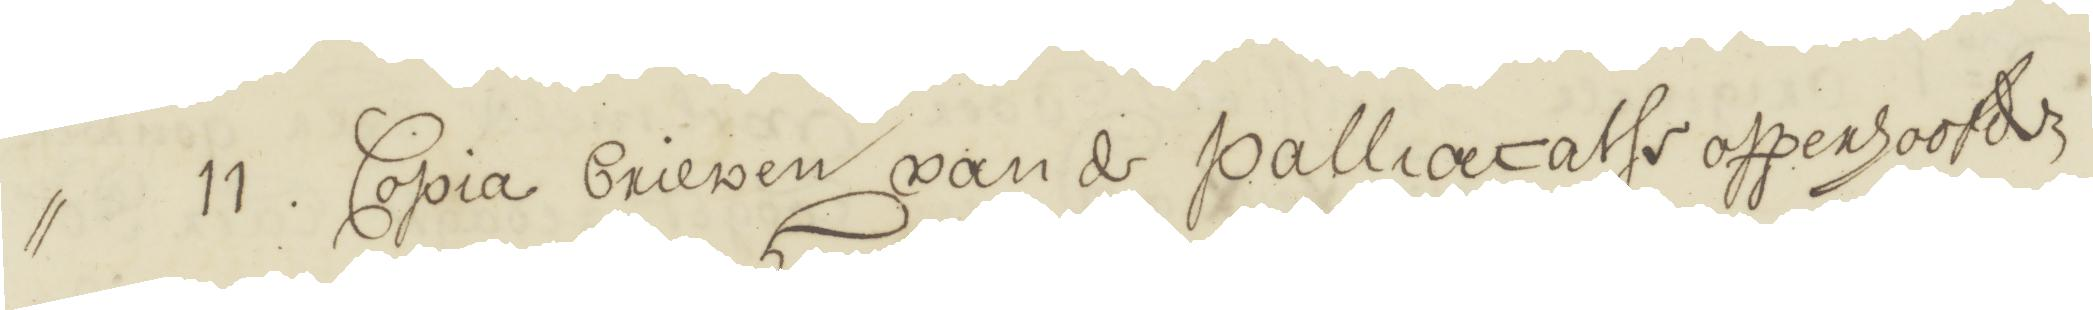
„ 11. Copia brieven van de palliacatse opperhoofden
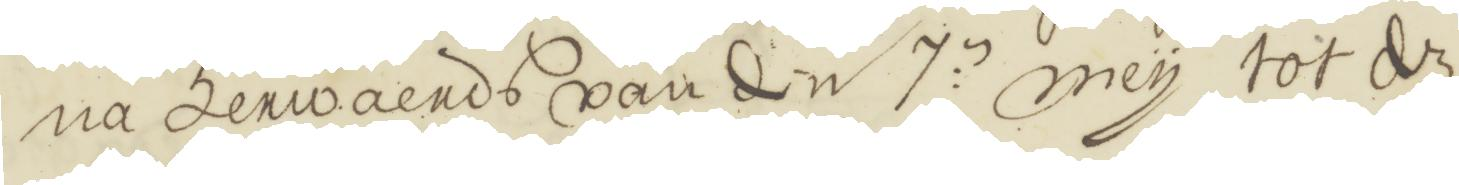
na herwaerds van den 7:e meij tot den
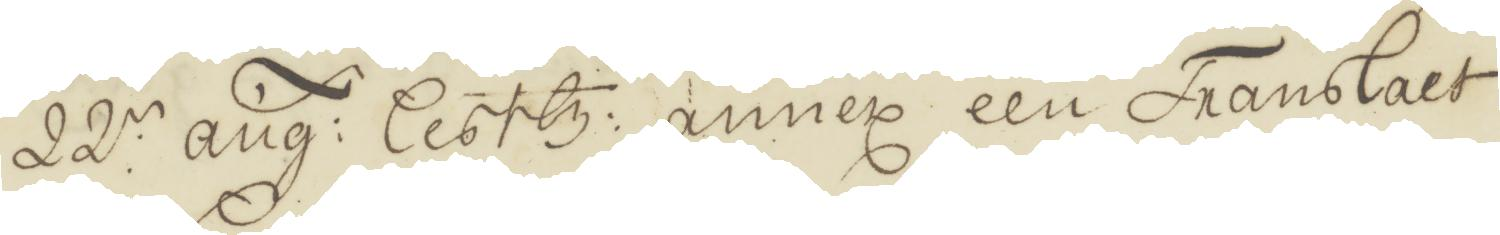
22:n aug: lestln: annex een Translaet
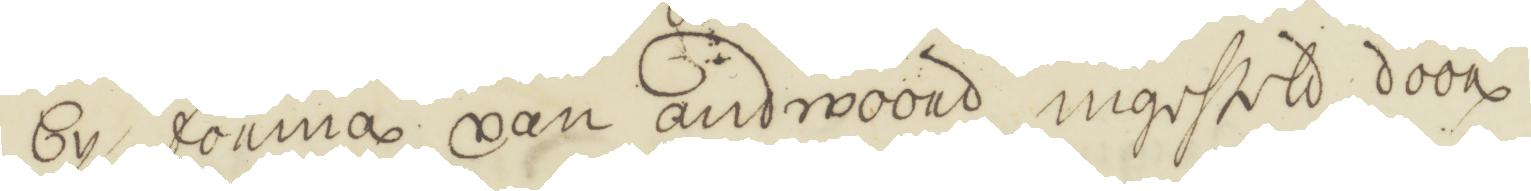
by forma van andwoord ingesteld door
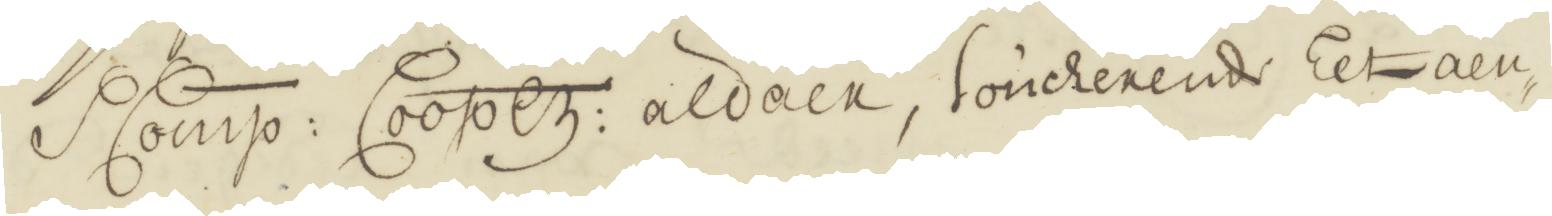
S Comp: Coopln: aldaer, toucherende het aen„
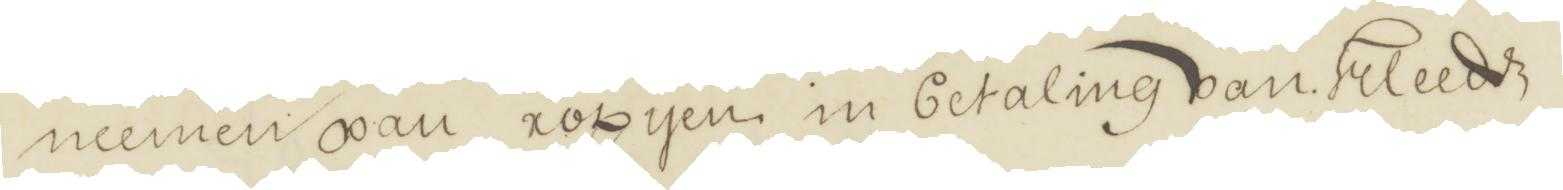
neemen van ropijen in betaling van kleeden
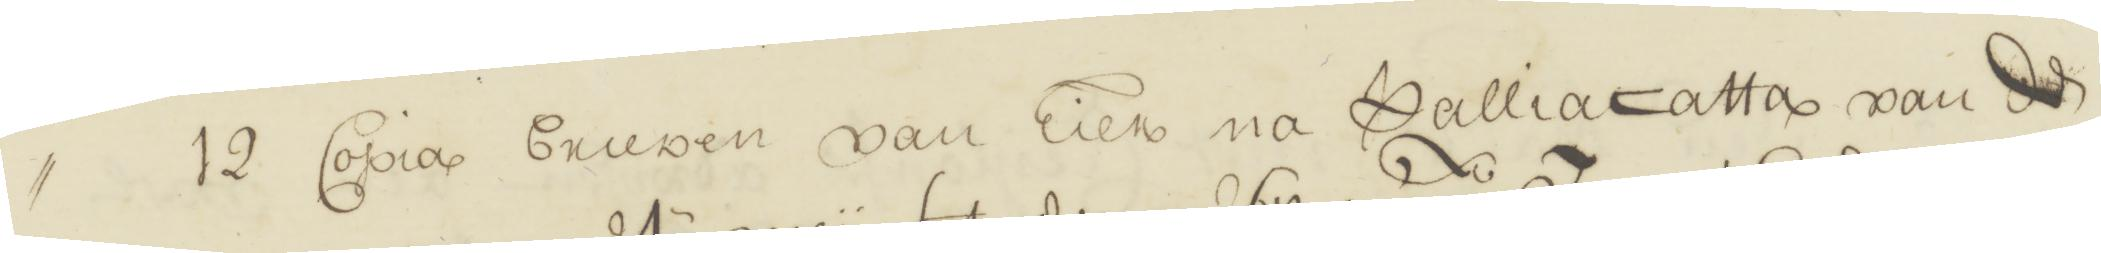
„ 12 Copia brieven van hier na Palliacatta van den
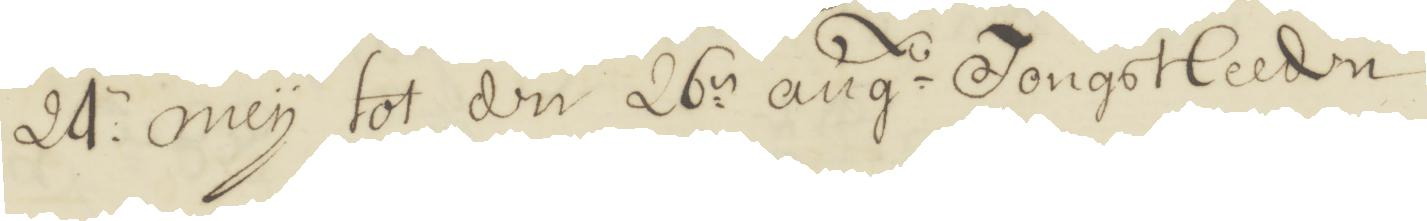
24:' meij tot den 26:e aug:o Iongstleeden
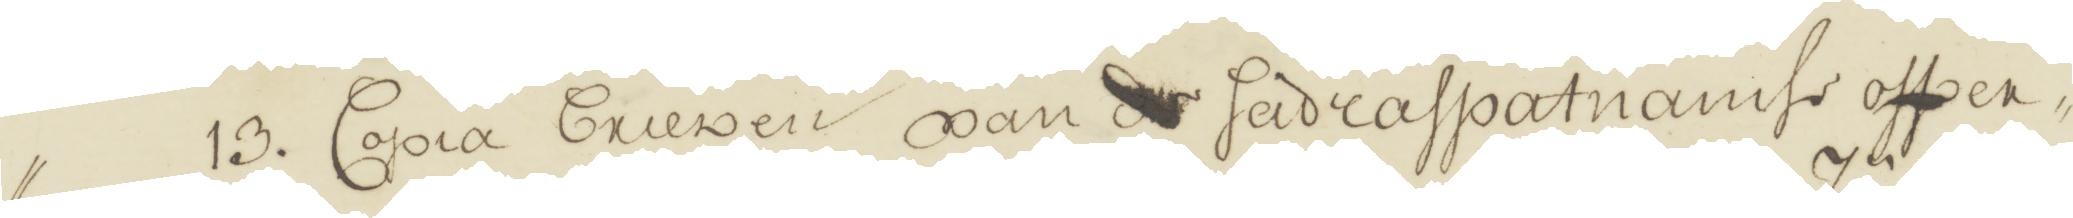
„ 13. Copia brieven van de sadraspatnamse opper„
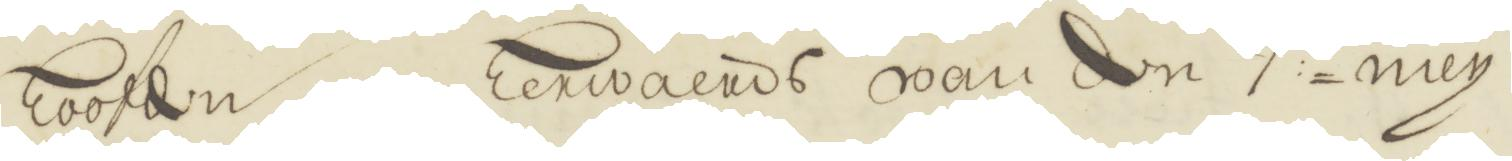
hoofden na herwaerds van den 7:e= mey
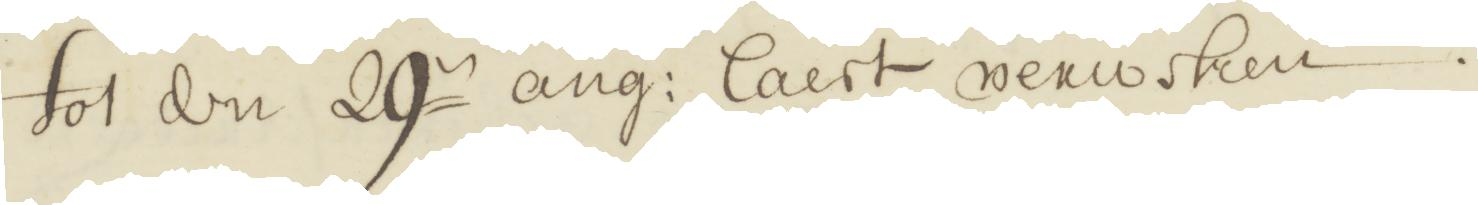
tot den 29=e aug:o laest verweken.
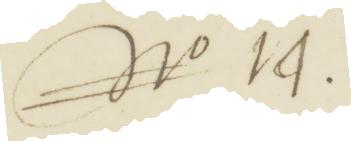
N:o 14.
